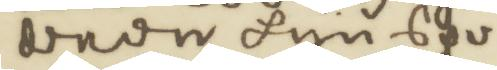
deren sijn spe
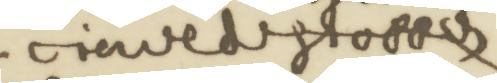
ciael de stoffen
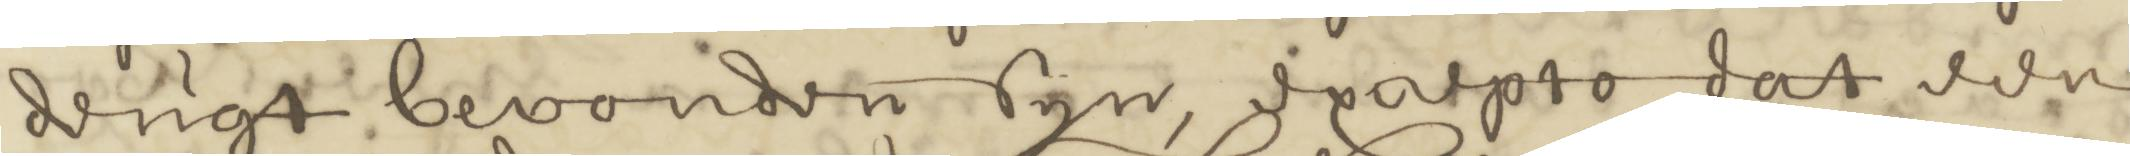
deugt bevonden sijn, excepto dat een
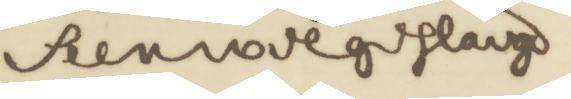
seer welgeslaegd
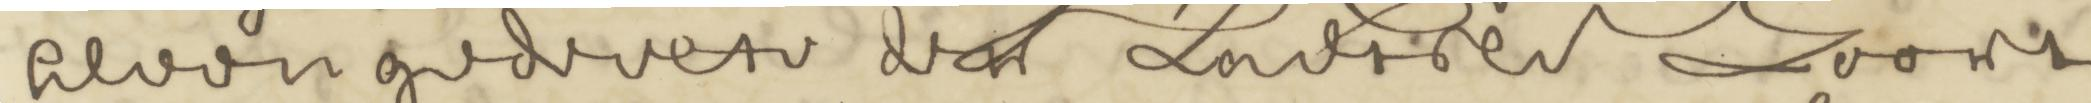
kleen gedeelte den Laetste zoort
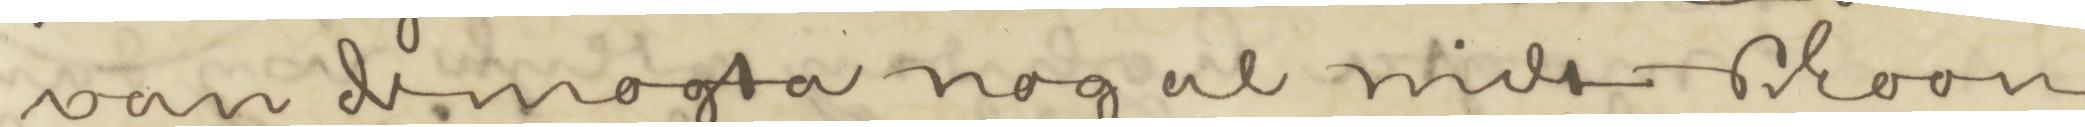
van de mogta nog al niet schoon
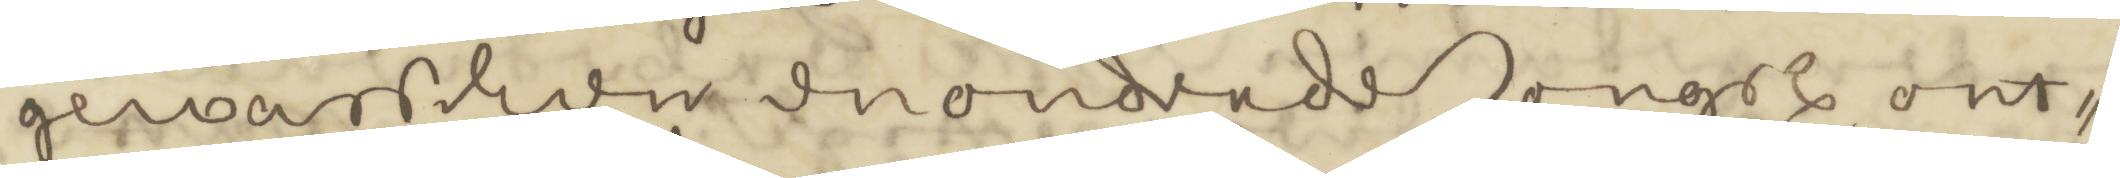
gewasschen en onder de jongst ont„
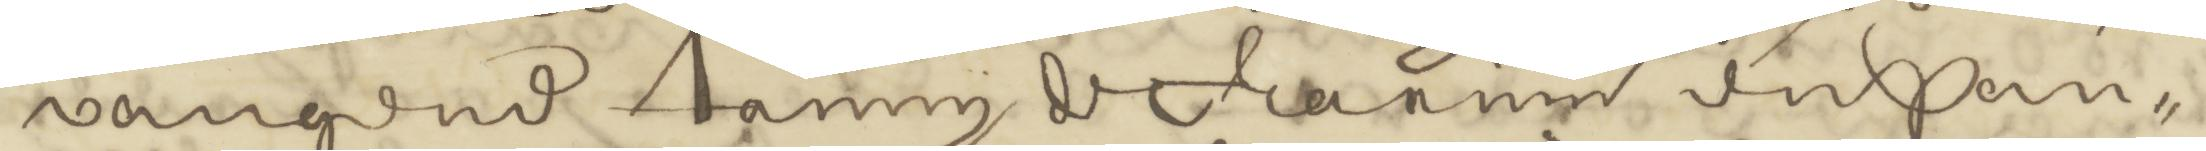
vangene tannij de charum en pan„
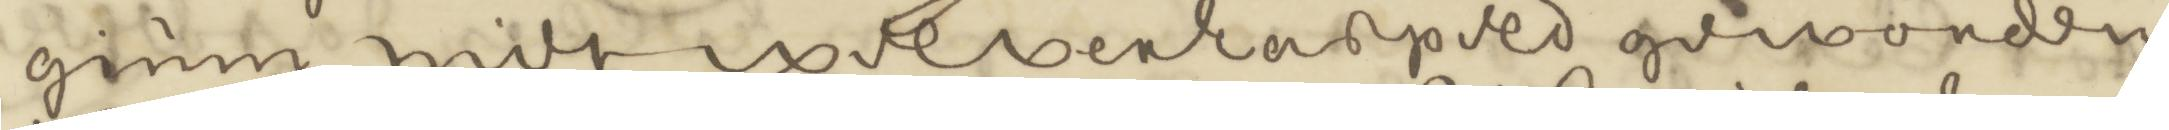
gium niet welverhaspeld geworden
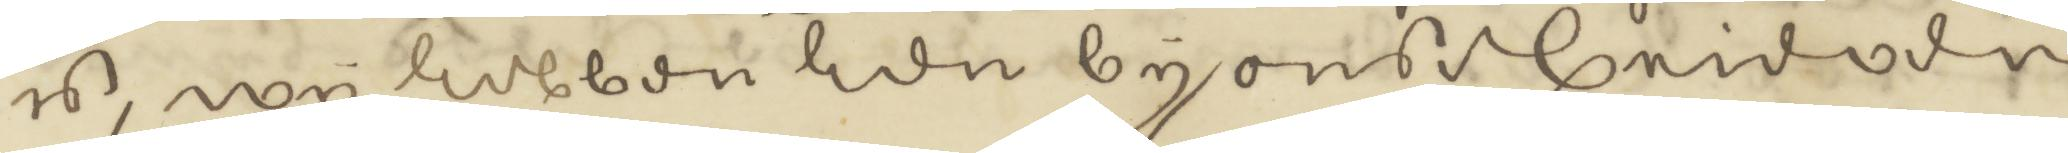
is, wij hebben hen bij onse brieven
